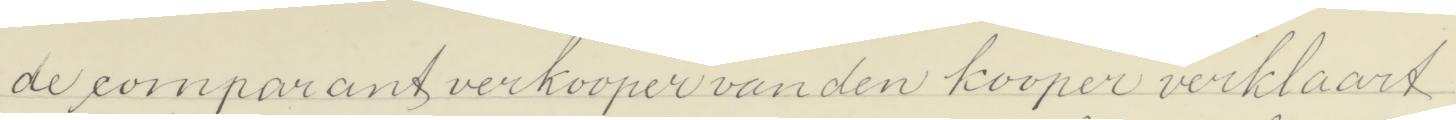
de comparant verkooper van den kooper verklaart
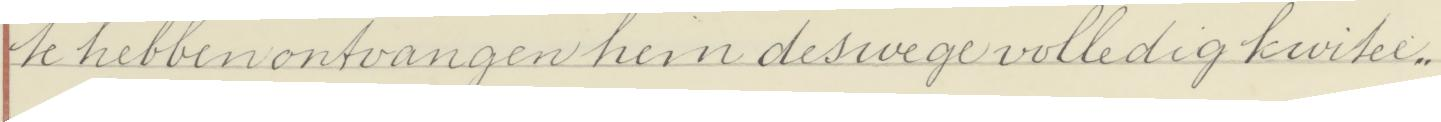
te hebben ontvangen hem deswege volledig kwitee„
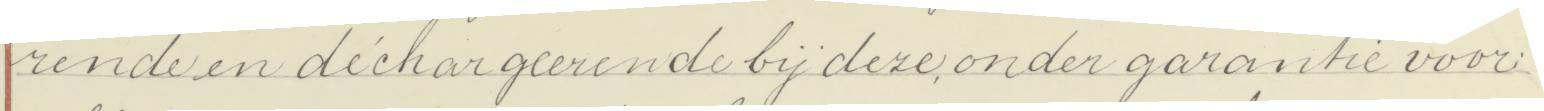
rende en déchargeerende bij deze onder garantie voor
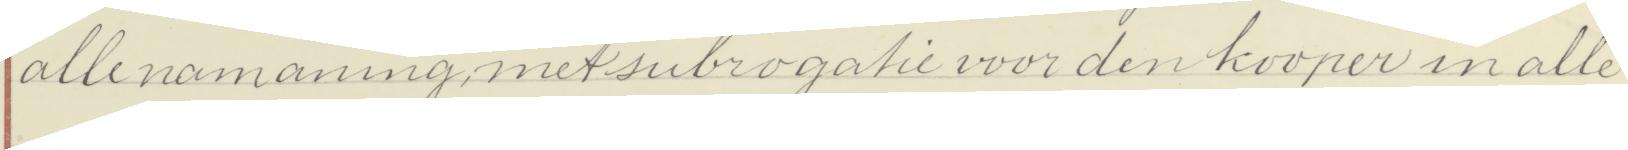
alle namaning, met subrogatie voor den kooper in alle
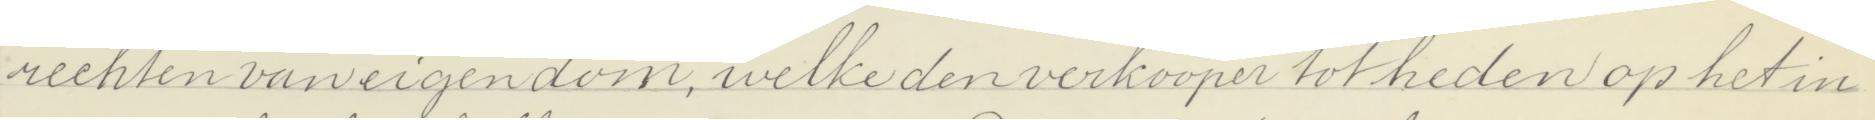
rechten van eigendom, welke den verkooper tot heden op het in
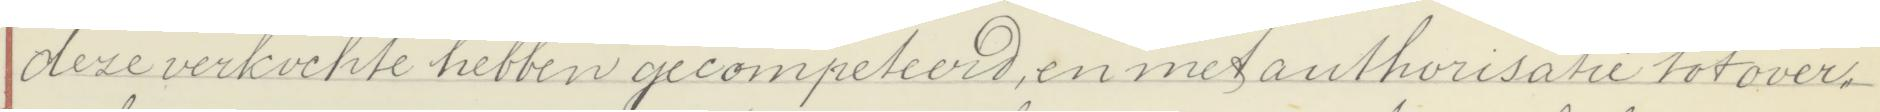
deze verkochte hebben gecompeteerd, en met authorisatie tot over„
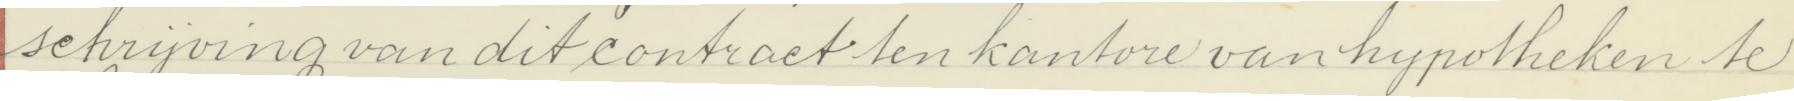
schrijving van dit contract ten kantore van hypotheken te
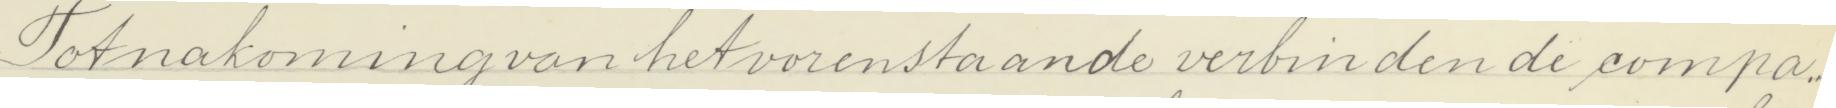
Tot nakoming van het vorenstaande verbinden de compa„
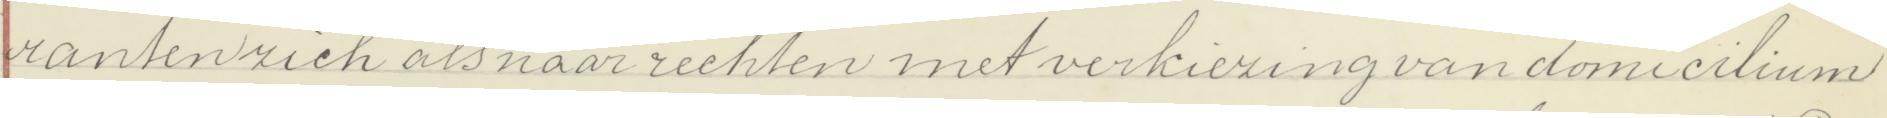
ranten zich als naar rechten met verkiezing van domicilium
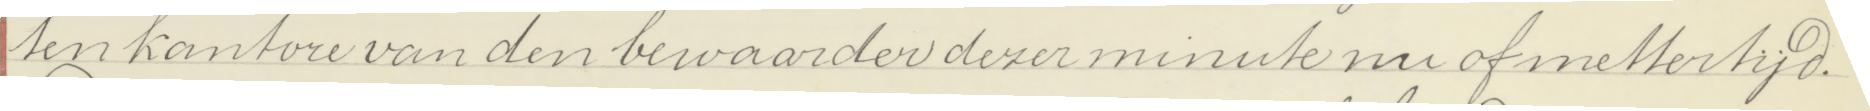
ten kantore van den bewaarder dezer minute nu of mettertijd.
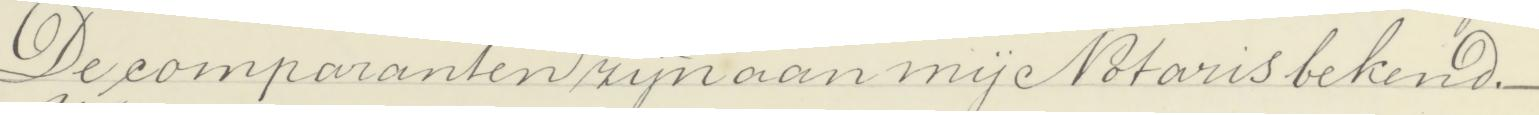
De comparanten zijn aan mij Notaris bekend.—
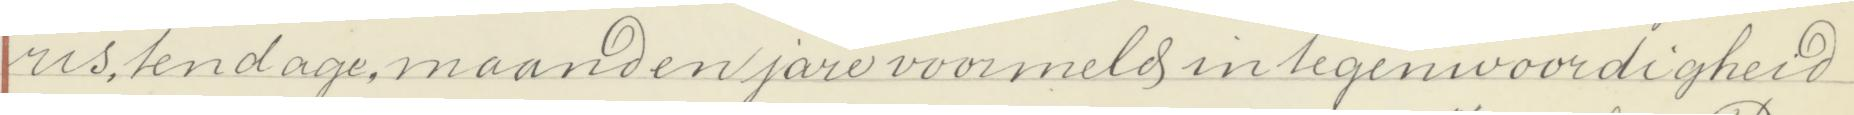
ris, ten dage, maanden jare voormeld in tegenwoordigheid
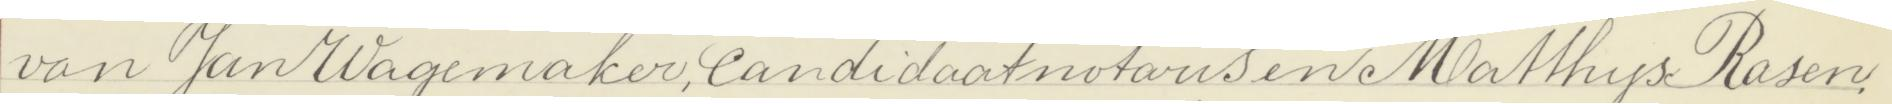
van Jan Wagemaker, Candidaat notaris en Matthys Rasen,
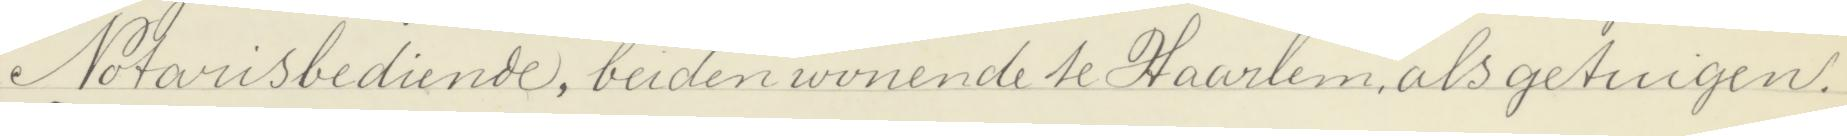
Notarisbediende, beiden wonende te Haarlem, als getuigen.
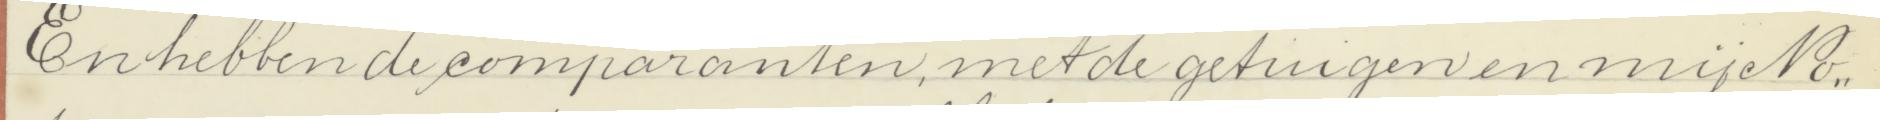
En hebben de comparanten, met de getuigen en mij No„
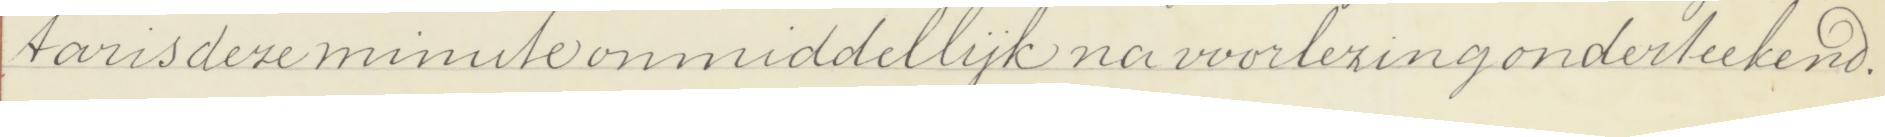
taris deze minute onmiddellijk na voorlezing onderteekend.
